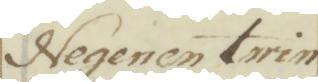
Negen en twin
